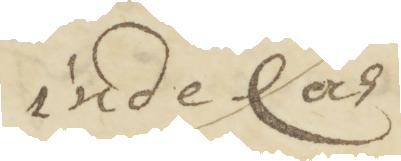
in de Cas
